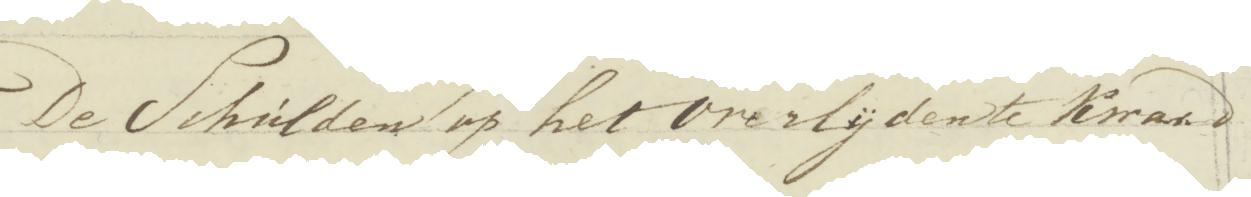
De Schulden op het overlijden te kward
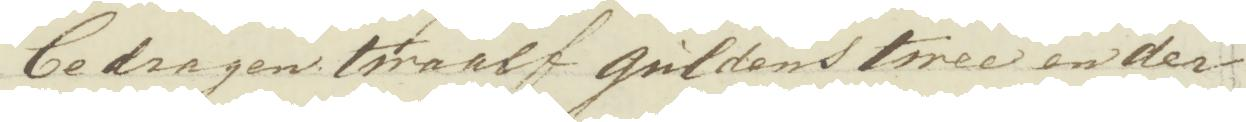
bedragen twaalf guldens twee en der
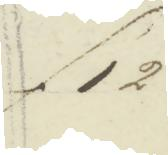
ƒ 12
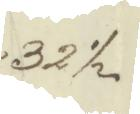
32½
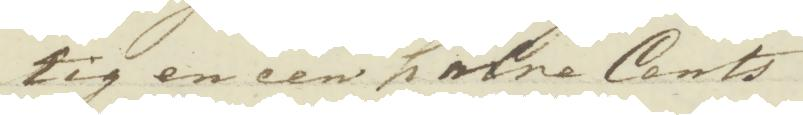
tig en een halve Cents
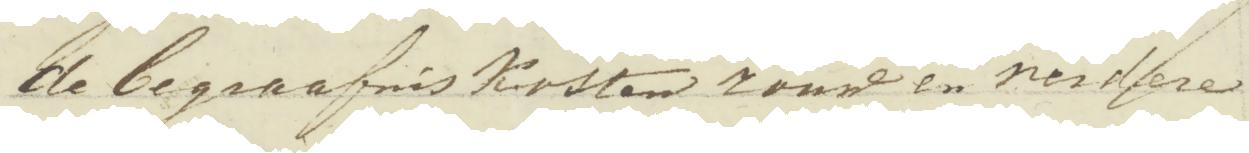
de begraafnis kosten rouw en verdere
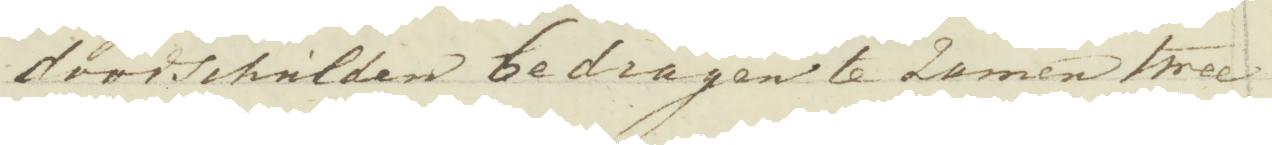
doodschulden bedragen te zamen twee
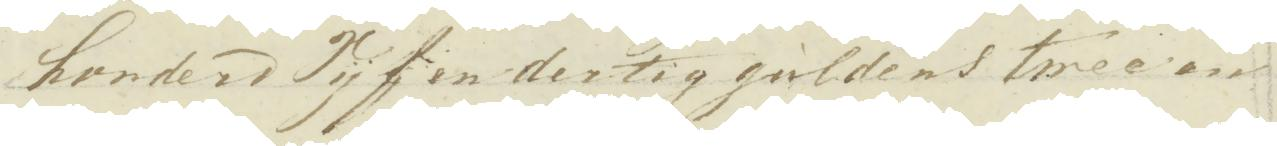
honderd Vijf en dertig guldens twee en
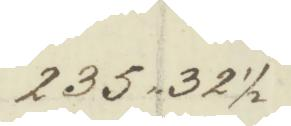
235„ 32½
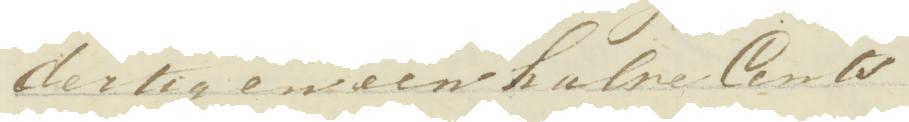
dertig en een halve Cents
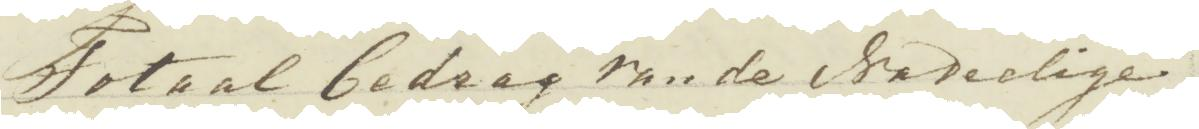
Totaal bedrag van de Nadeelige
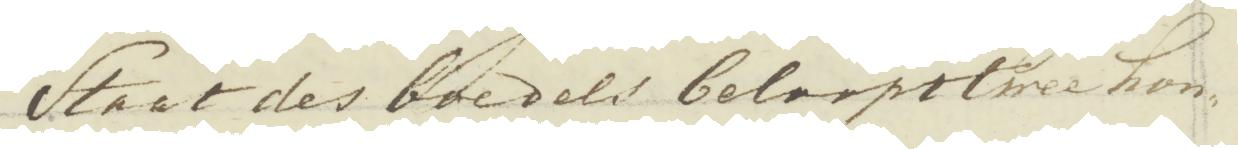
staat des boedels beloopt twee hon„
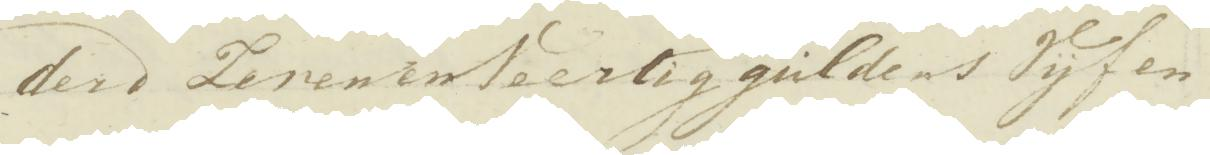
derd Zeven en Veertig guldens Vijf en
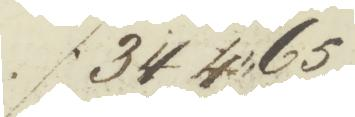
ƒ 344„ 65
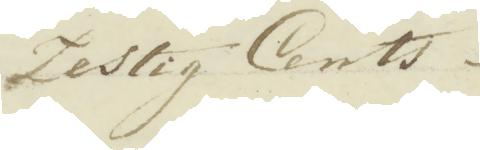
Zestig Cents -
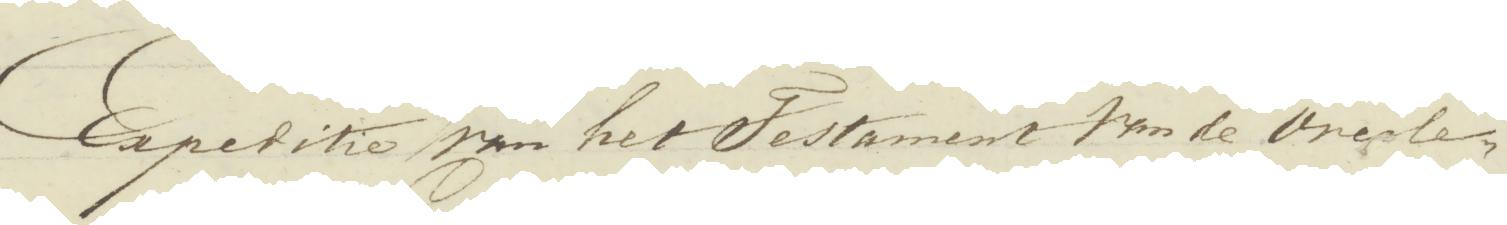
Expeditie van het Testament van de overle„
